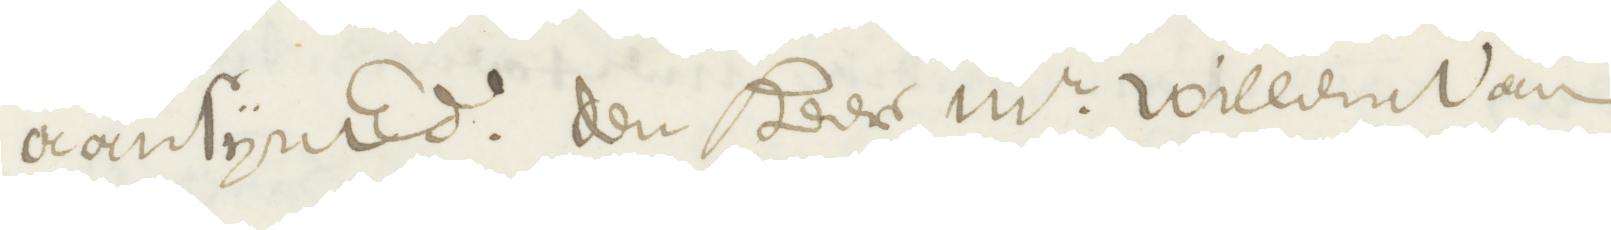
aan sijn Ed.t den Heer m.r willem Van
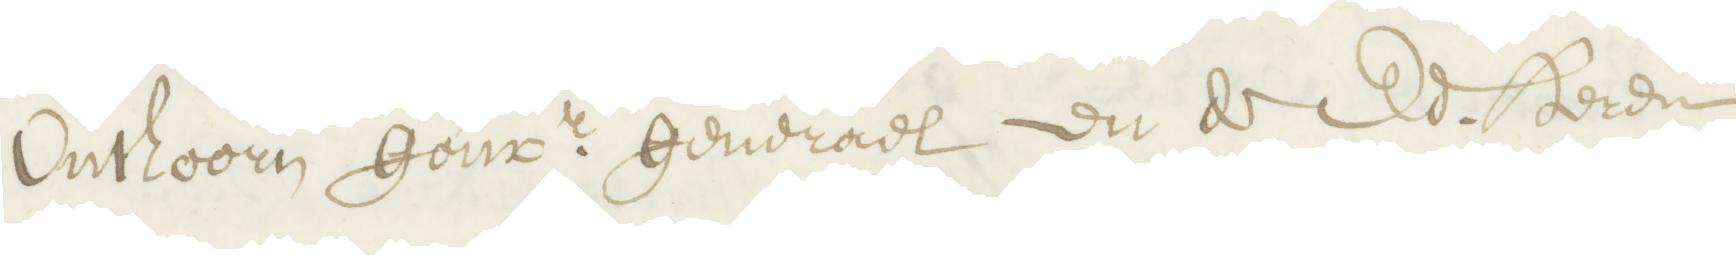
Outhoorn gouv.r generael en de Ed. Heren
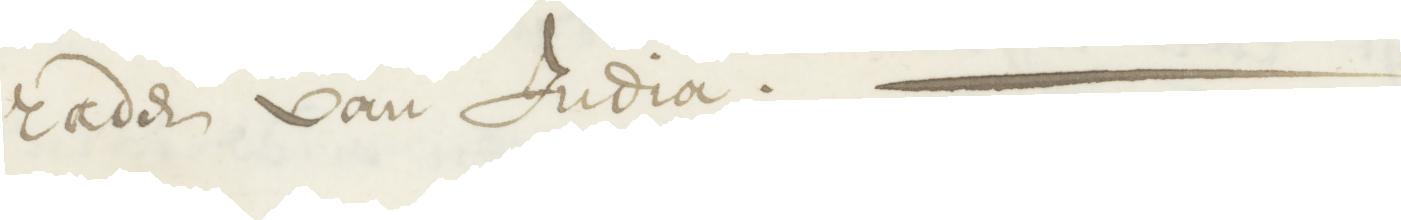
raden van India. —
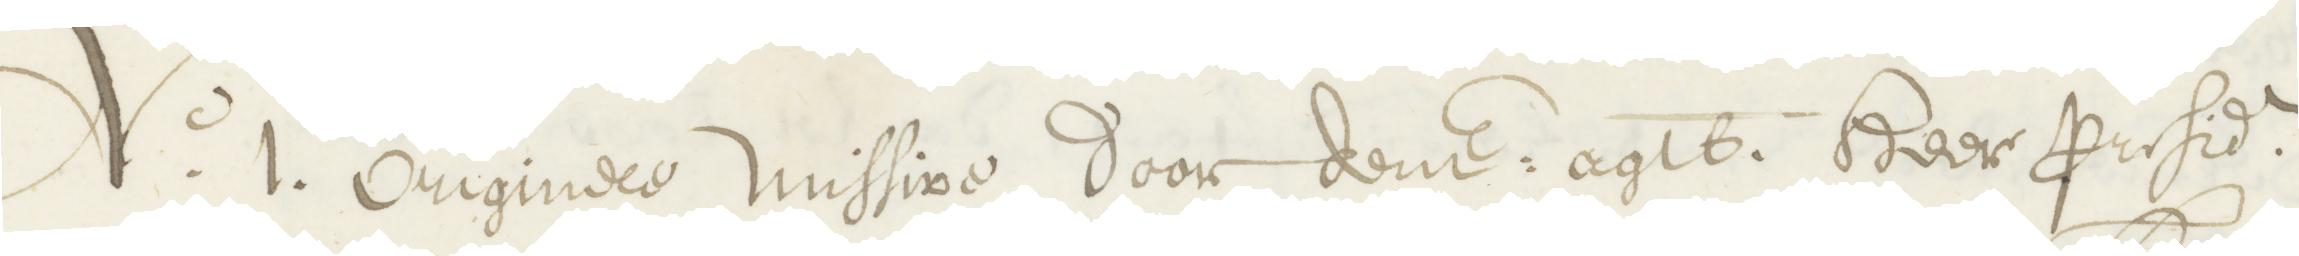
N.o 1. Originele Missive door den E: agtb. Heer Presid.t
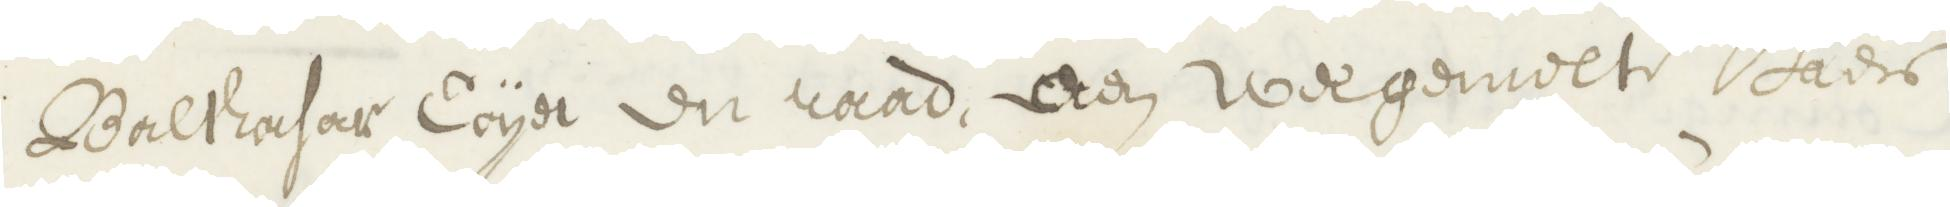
Balthasar Coijet en raad, een wel gemelte Haer
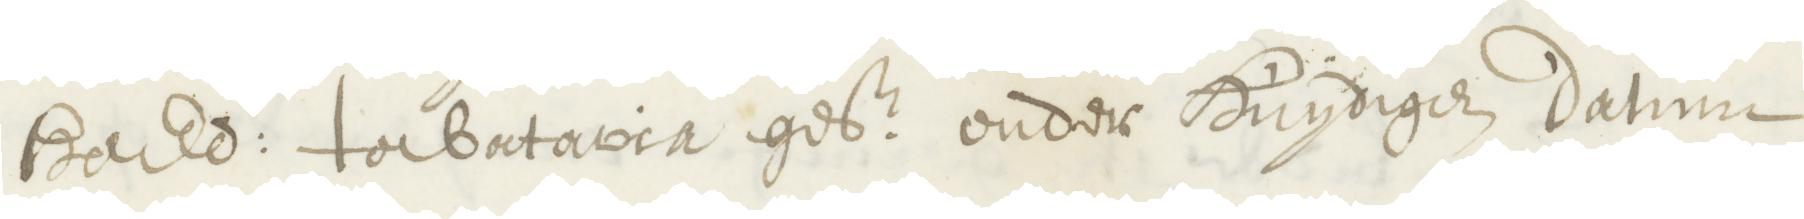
HoEd: totbatavia ges: onder huijdigen datum
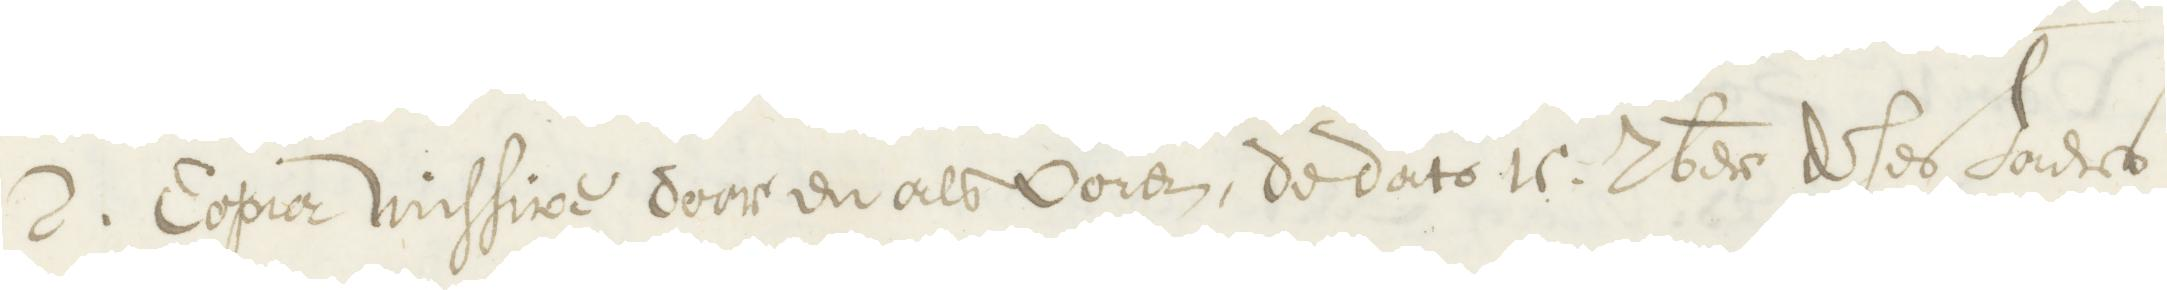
2. Copia Missive door en als voren, de dato 15. 7ber deses Iaers
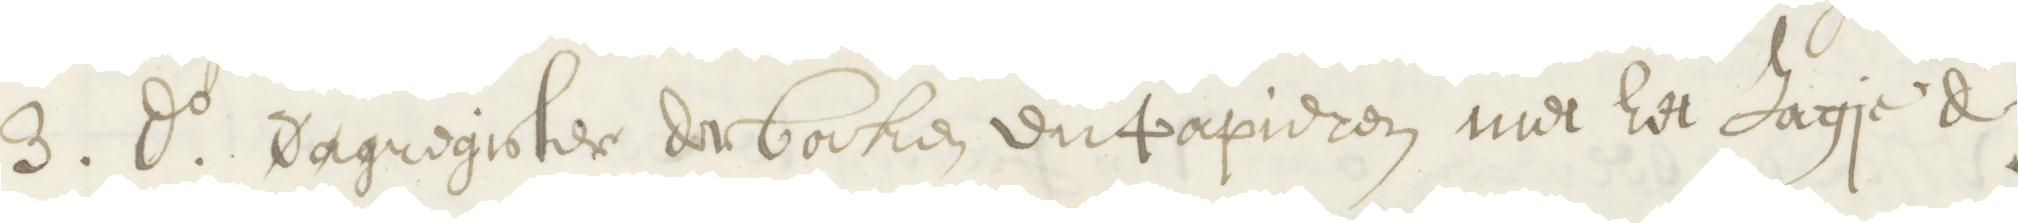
3. d.o dagregister der boeken en papieren met het Iagje de
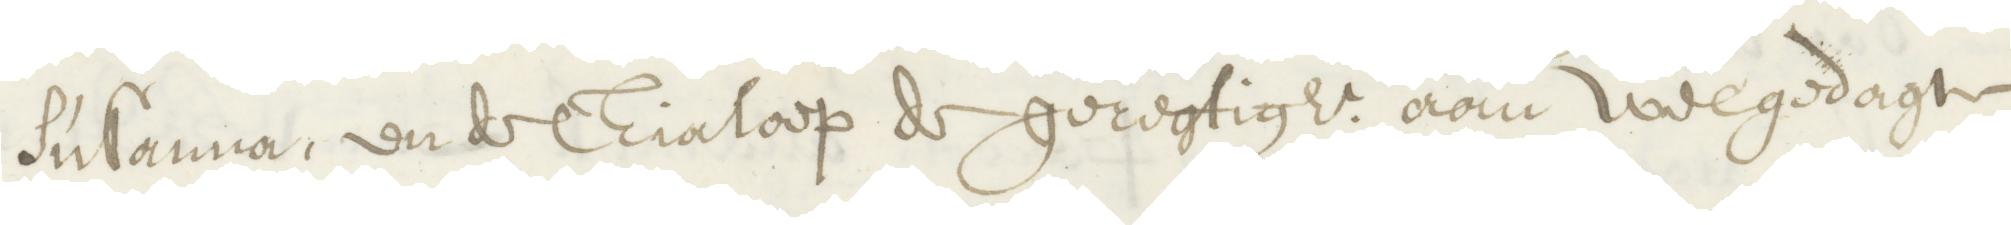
susanna, en de Chialoep de geregtigh.t aan Wel gedagte
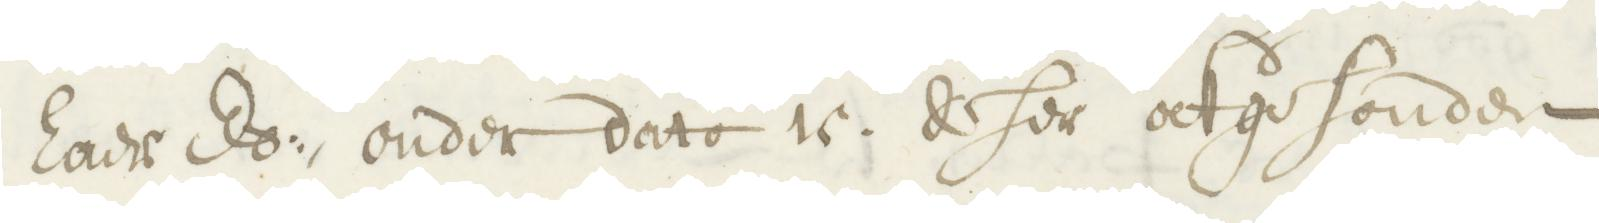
haer Ed:, onder dato 15. deser afgesonden
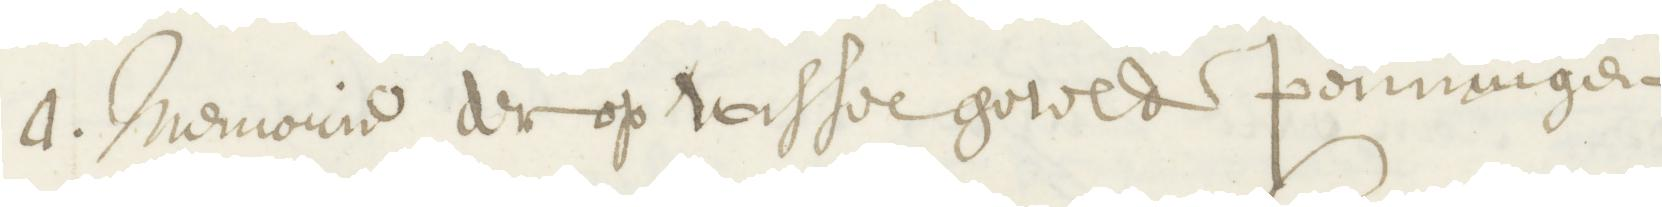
4. Memorie der op wissel getelde penningen —
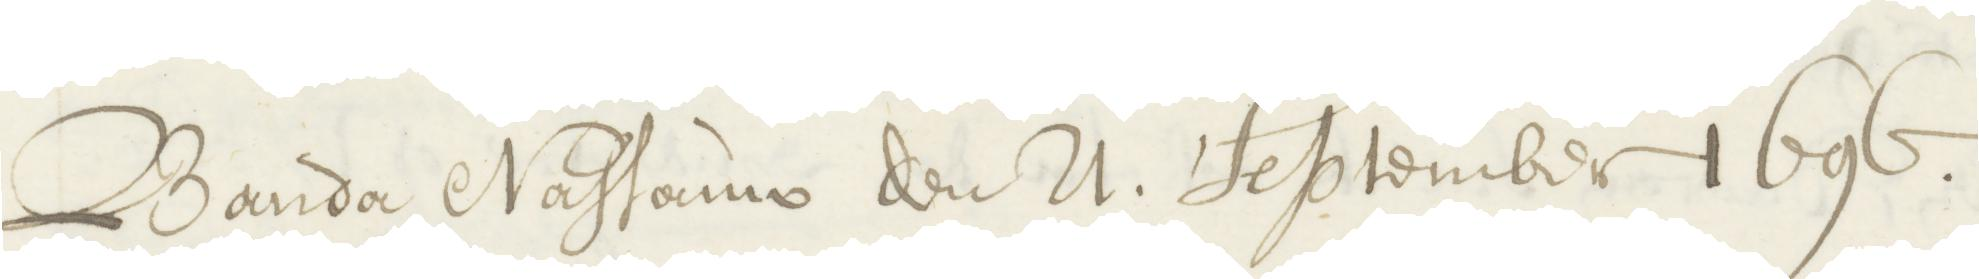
Banda Nassauw den 21. September 1696.
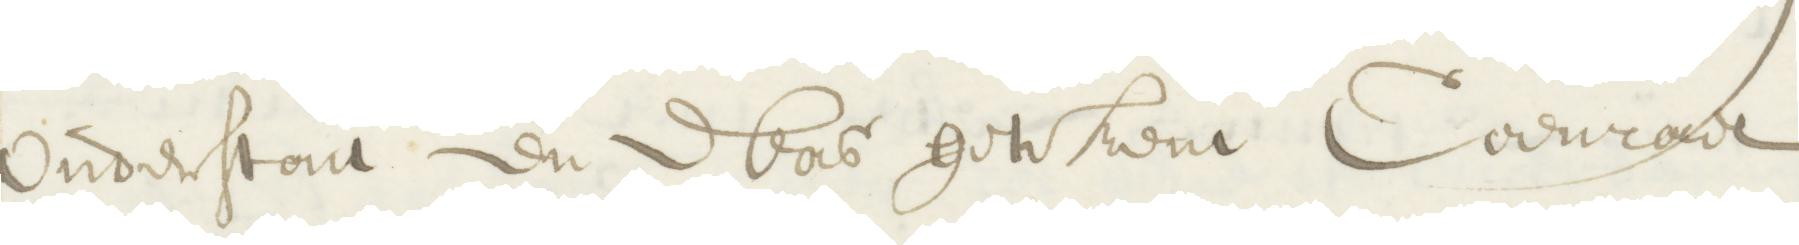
Onderstont en Was getekent Coenraet
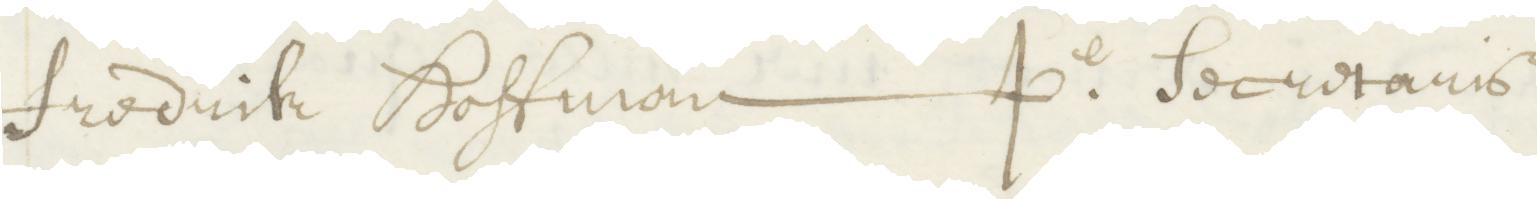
fredrik Hoffman — P.e secretaris
